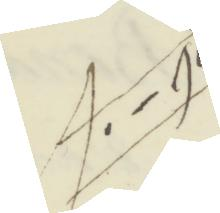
ƒ.—98 5
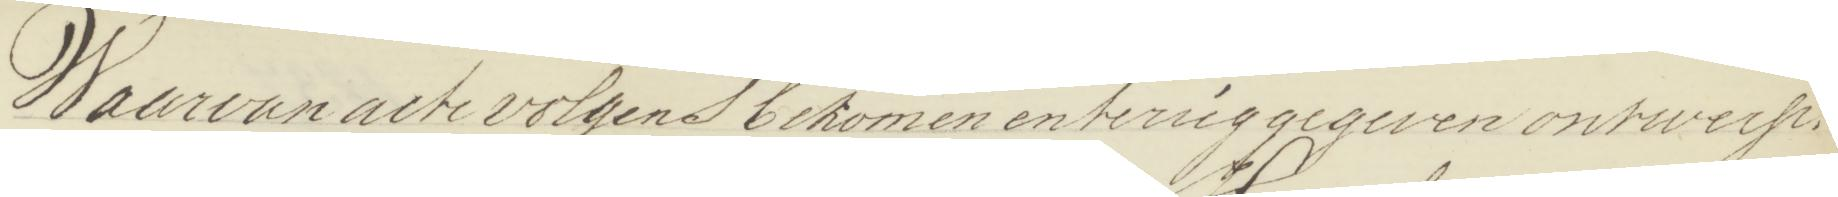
Waarvan acte volgens bekomen en terug gegeven ontwerp.
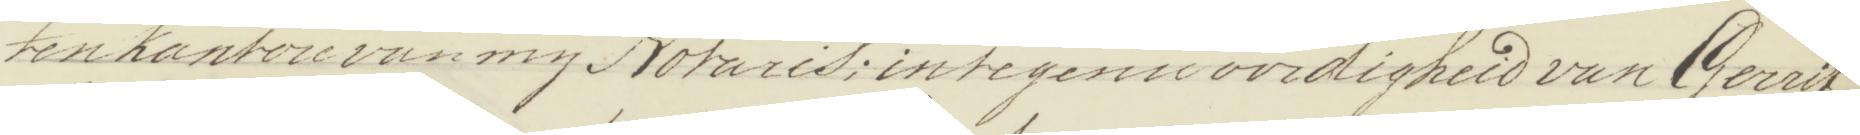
ten kantore van my Notaris; in tegenwoordigheid van Gerrit
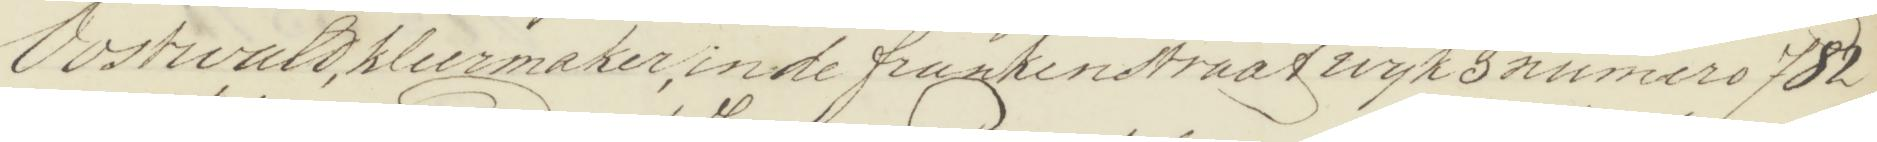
Oostwald, kleermaker, in de frankenstraat wyk 3 numero 782
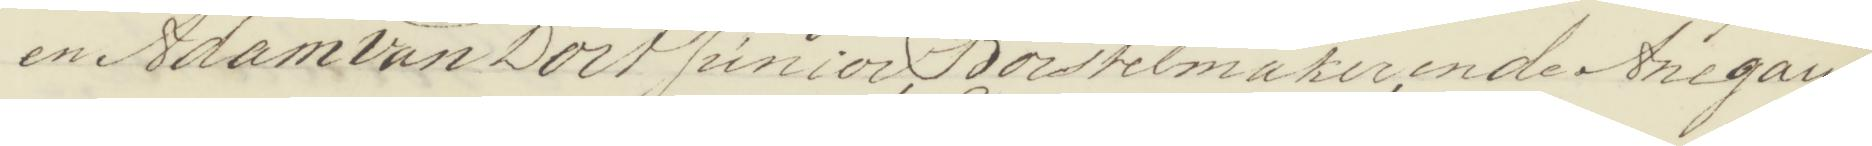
en Adam van Dort Junior, Borstelmaker, in de Anegang
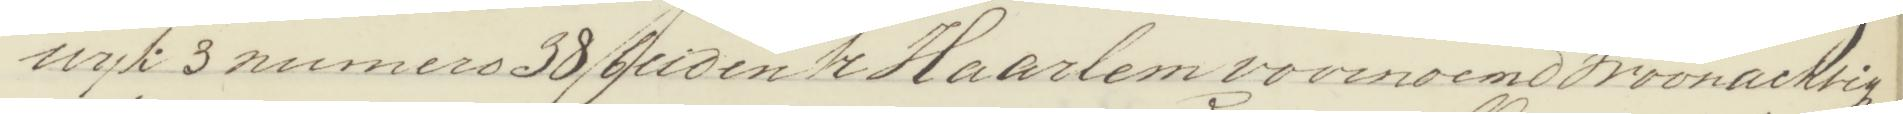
wyk 3 numero 3 beiden te Haarlem voornoemd woonachtig
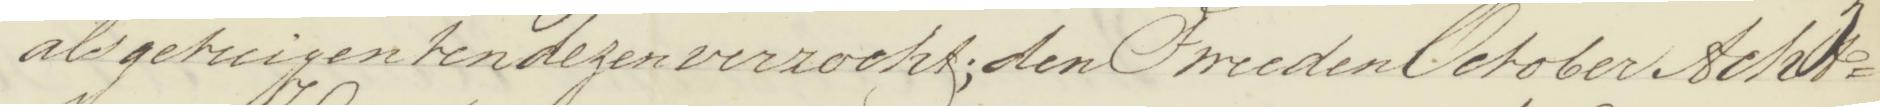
als getuigen ten dezen verzocht; den Tweeden October Acht=
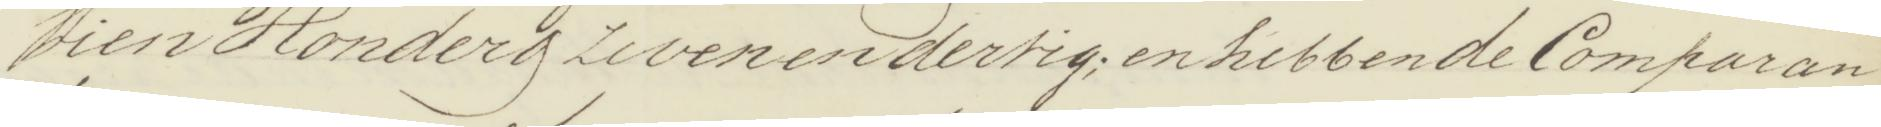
dien Honderd Zeven en dertig; en hebbende Comparan
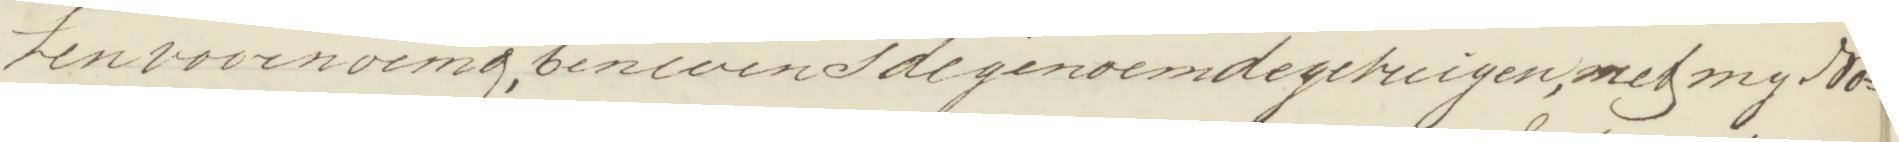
ten voornoemd, benevens de genoemde getuigen, met my No=
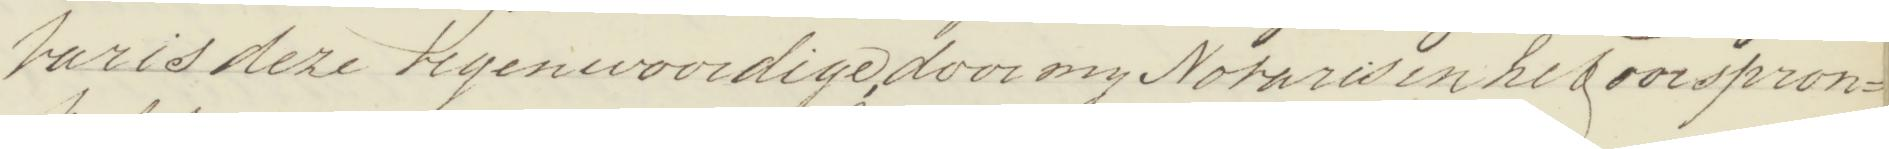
taris deze tegenwoordige, door my Notaris in het oorspron=
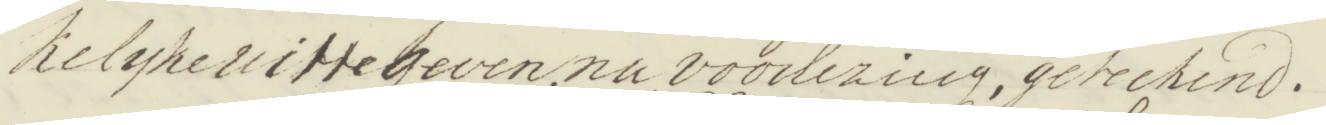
kelyke uittegeven, na voorlezing, geteekend.
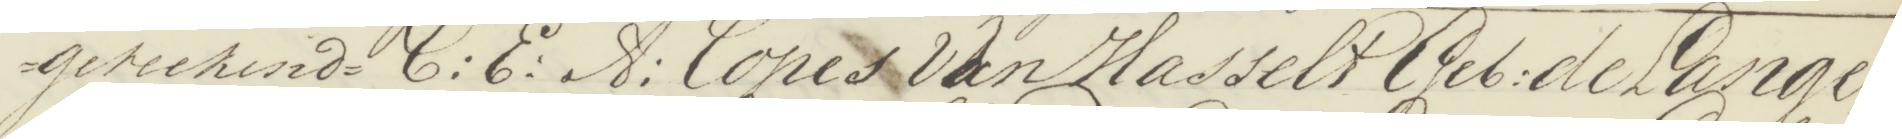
=geteekend= C: E: A: Copes Van Hasselt Geb: de Lange,
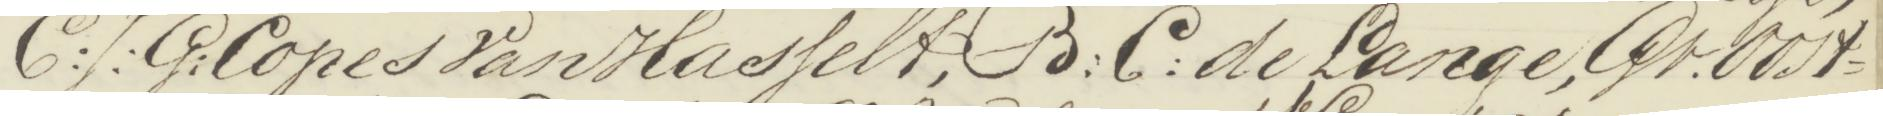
C:J:G:Copes van Hasselt, B: C: de Lange Gt. Oost=
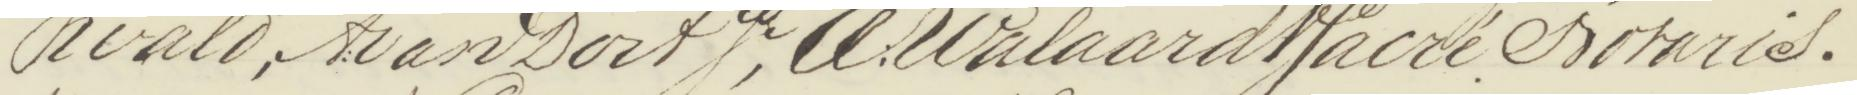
wald, A:van Dort Jr, AE: WalaardtSacré Notaris.
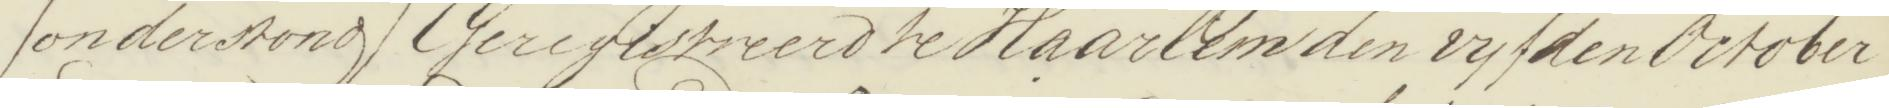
onderstond/ Geregistreerd te Haarlem den vyfden October
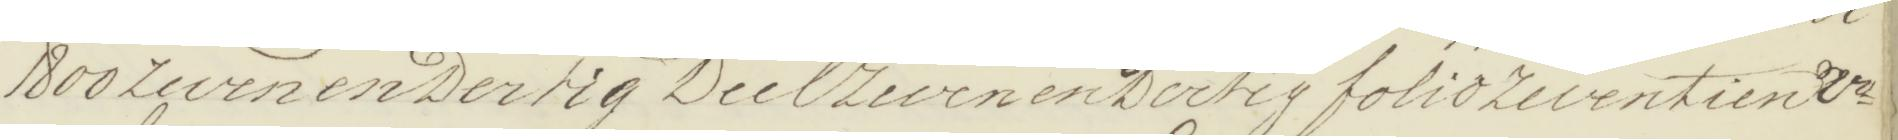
1800 zeven enDertig Deelzeven enDertig folio zeventien V-o
